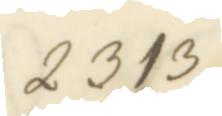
2313
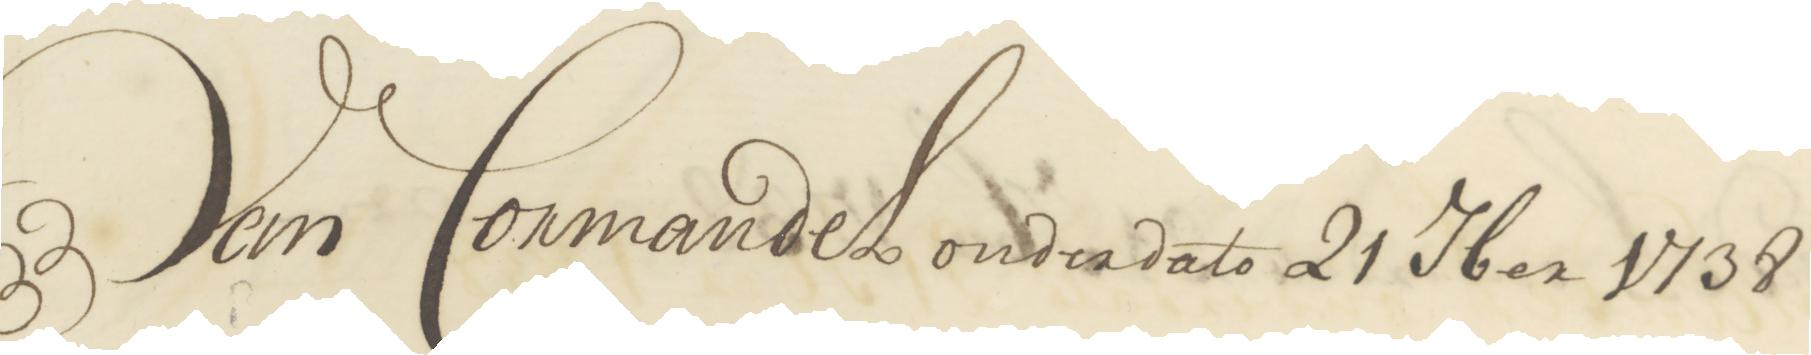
Van Cormandel onder dato 21 Iber 1738
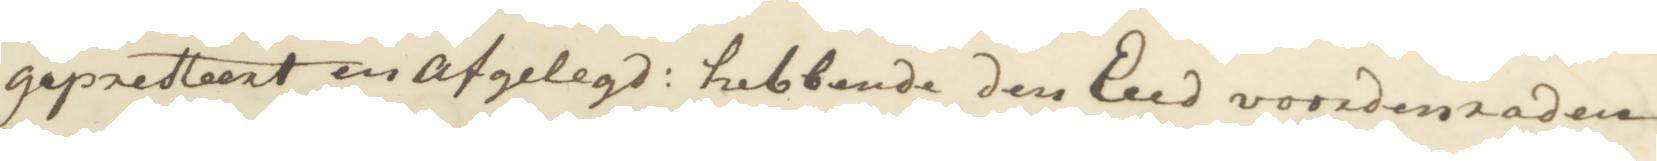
gepresteert en afgelegd: hebbende den Eed voorden raden
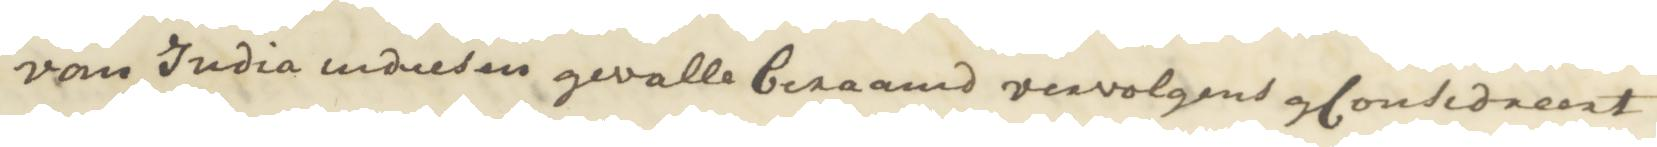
van India indeesen gevalle beraamd vervolgens gconsidreert
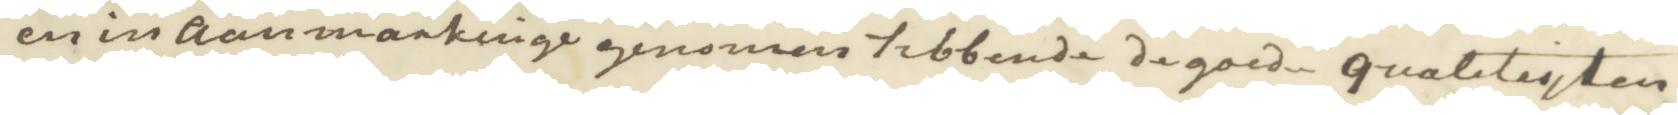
en in aanmarkinge genomen hbbende de goede qualiteijten
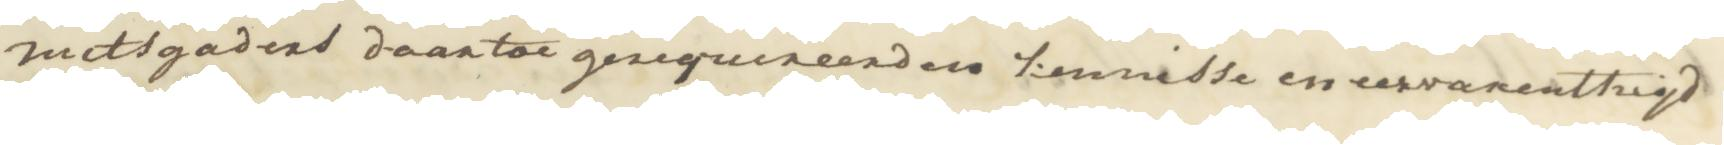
mitsgaders daar toe gerequireerden kennisse en eervarentheijd
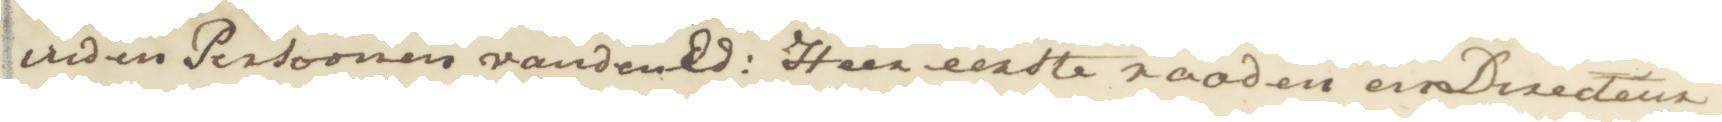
inden Persoonen van den Ed: Heer eerste raaden en Directeur
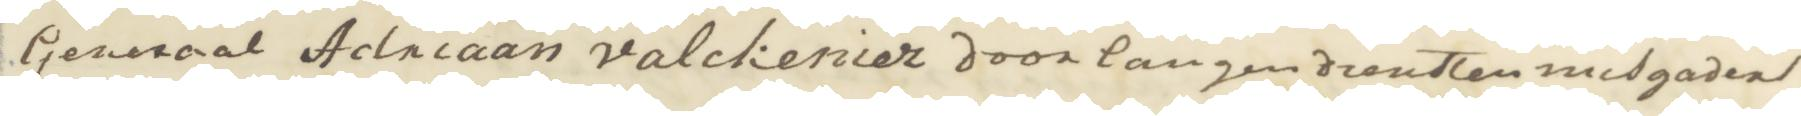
Generaal Adriaan valckenier door langen diensten misgaders
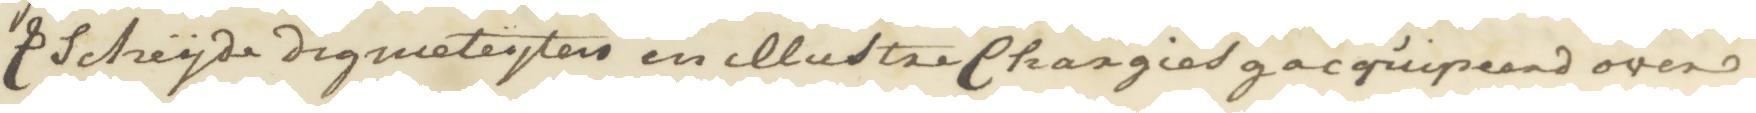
verscheijde dignieteijten en illustre Chargies gacquipeerd over
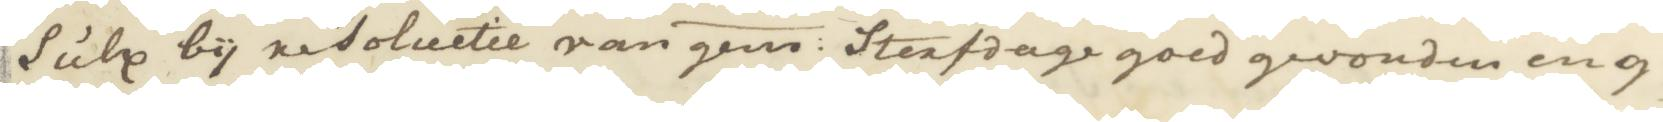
sulx bij resoluetie van gem: sterfdage goed gevonden en g
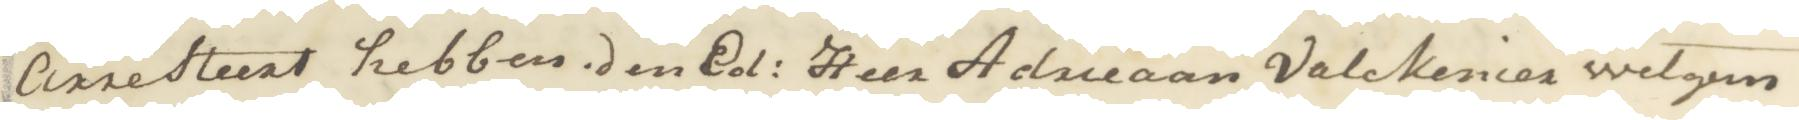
Arresteert hebben den Ed: Heer Adrieaan Valckenier welgem
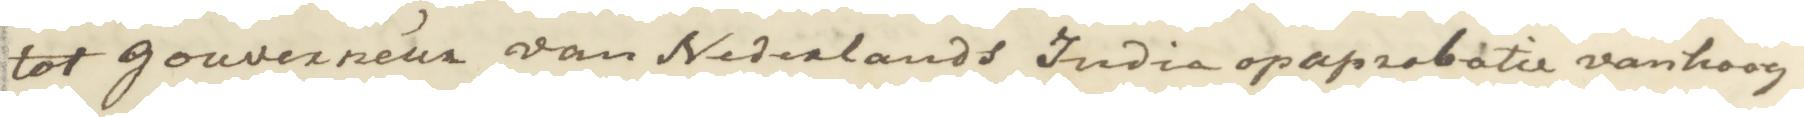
tot gouverneur van Nederlands India op aprobatie van hoog
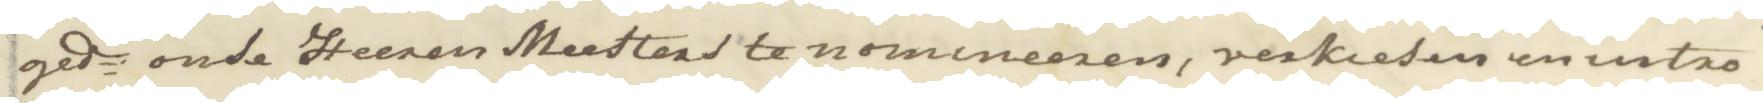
ged= onse Heeren Meesters te nomineeren, verkiesen en intro
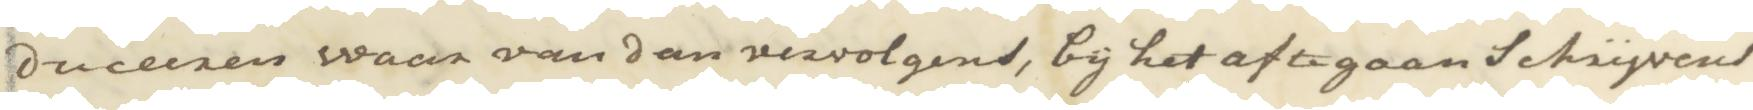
duceeren waar van dan vervolgens, bij het af te gaan schrijvens
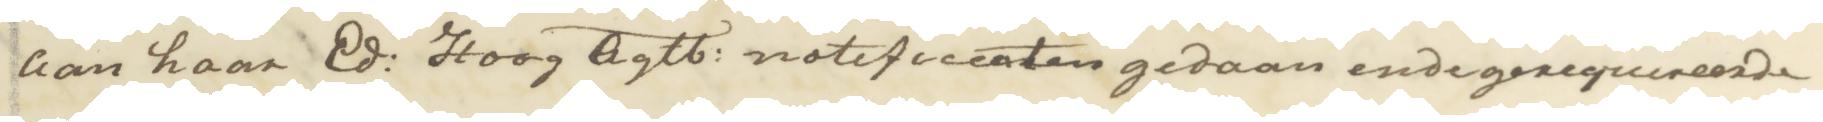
aan haar Ed: Hoog Agtb: notificcaten gedaan ende gerequireerde
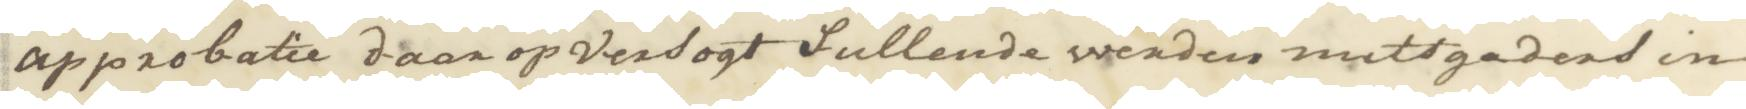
approbatie daar op versogt sullende werden mitsgaders in
